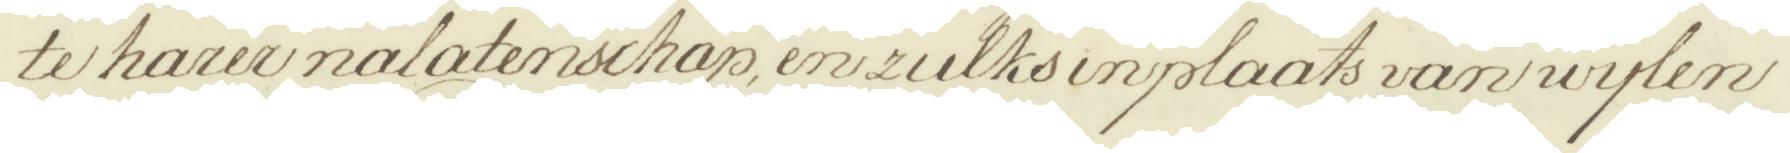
te harer nalatenschap, en zulks inplaats van wylen
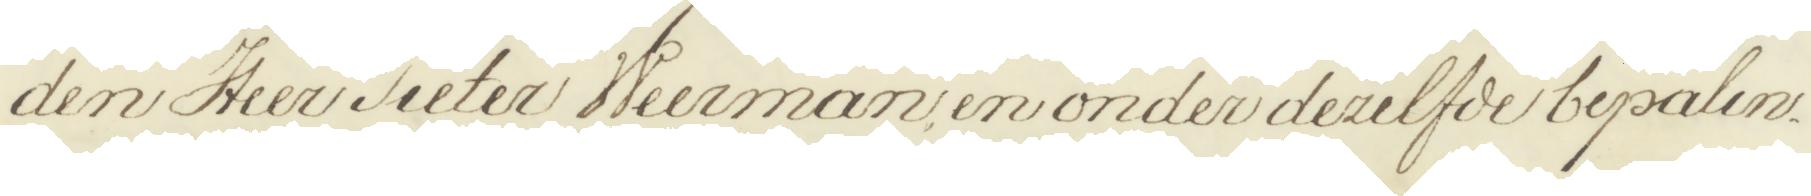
den Heer Pieter Weerman, en onder dezelfde bepalin„
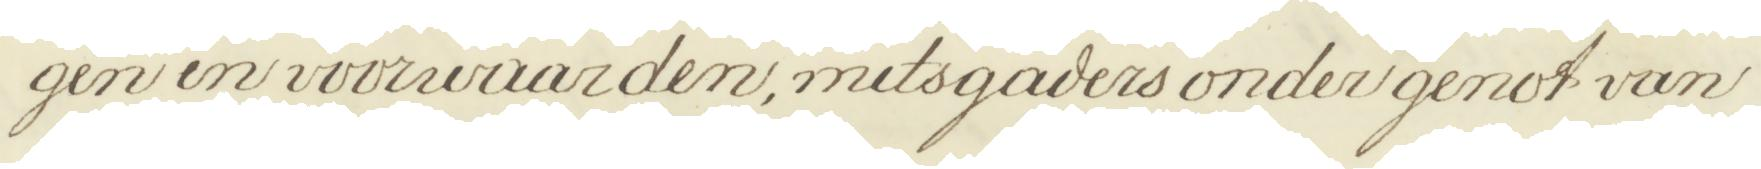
gen en voorwaarden, mitsgaders onder genot van
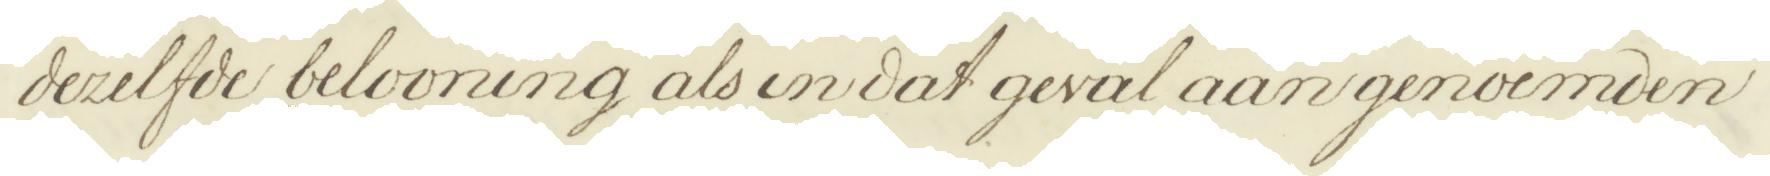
dezelfde belooning als in dat geval aan genoemden
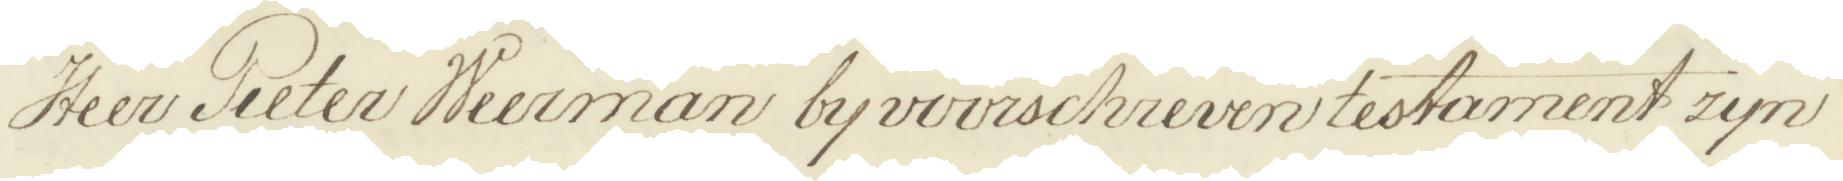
Heer Pieter Weerman by voorschreven testament zyn
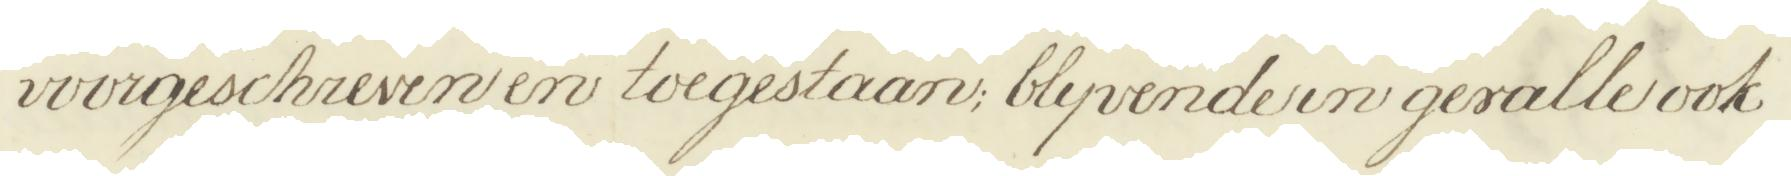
voorgeschreven en toegestaan; blyvende in gevalle ook
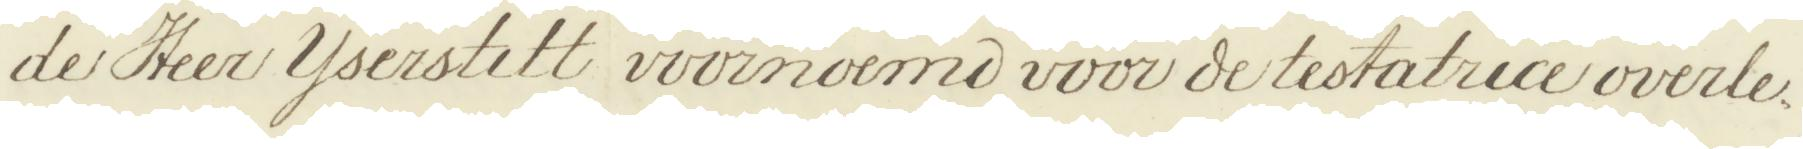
de Heer Yserstitt, voornoemd voor de testatrice overle„
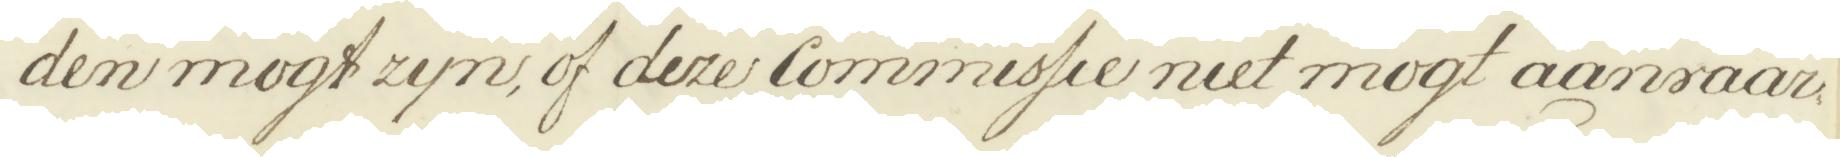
den mogt zyn, of deze commissie niet mogt aanvaar„
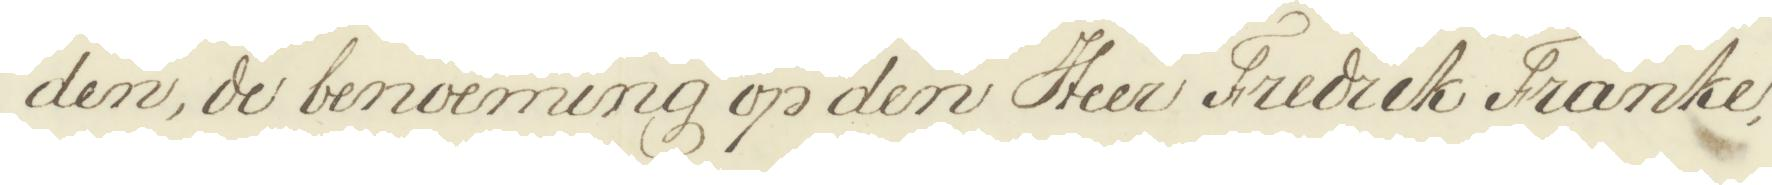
den, de benoeming op den Heer Fredrik Franke,
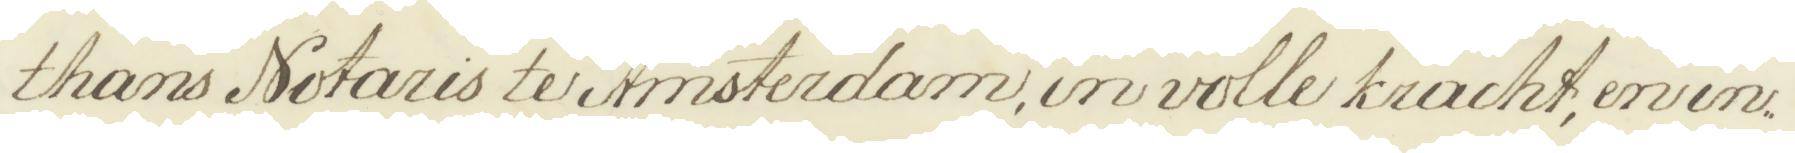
thans Notaris te Amsterdam, in volle kracht, en in„
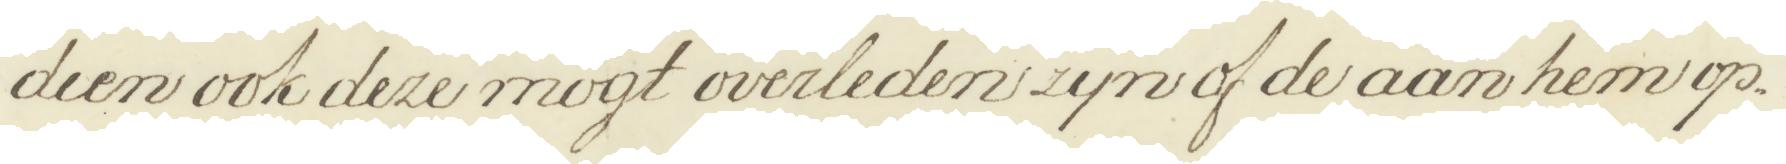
dien ook deze mogt overleden zyn of de aan hem op„
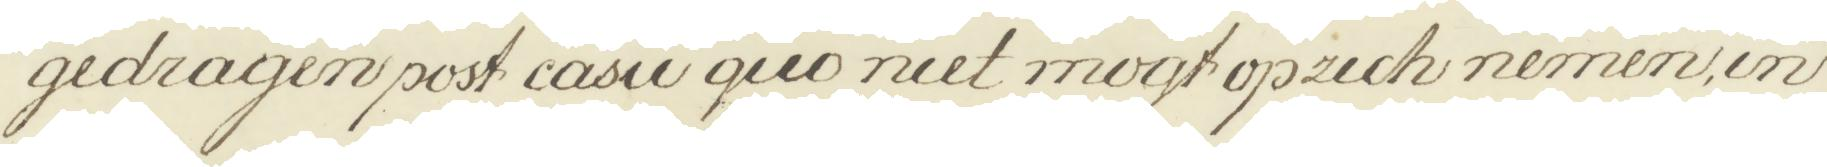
gedragen post casu quo niet mogt op zich nemen, in
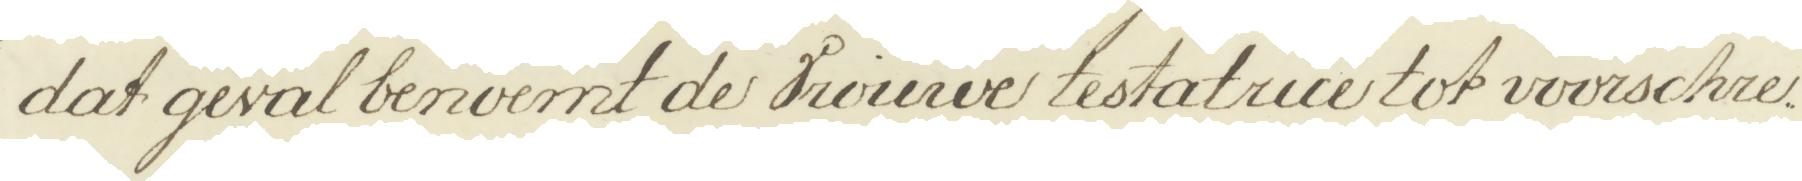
dat geval benoemt de Vrouwe testatrice tot voorschre„
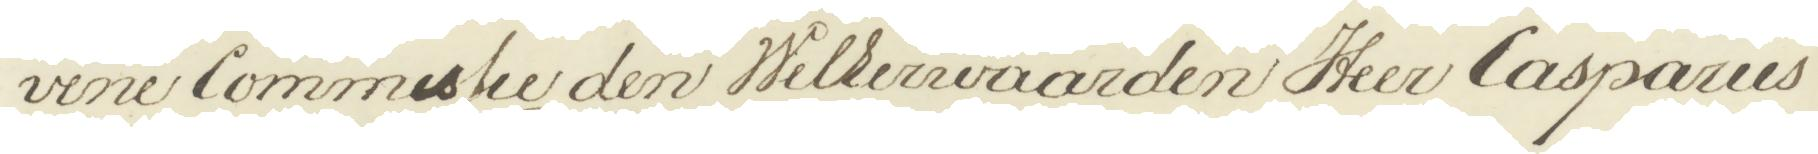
vene Commissie den Weleerwaarden Heer Casparus
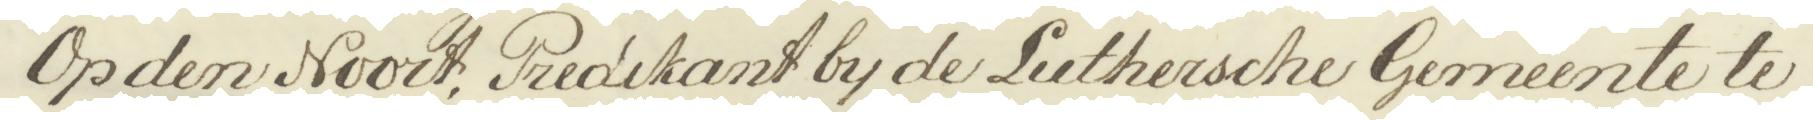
Op den Noort, Predikant by de Luthersche Gemeente te
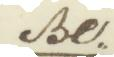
Be„
